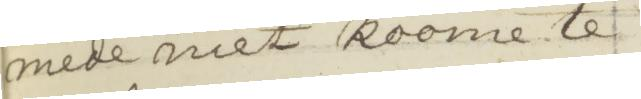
mede niet koome te
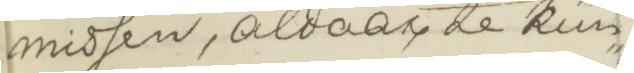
missen, aldaar te kun„
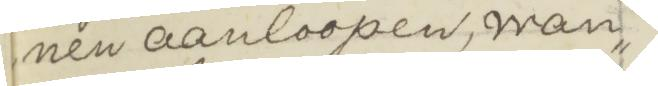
„nen aanloopen, wan„
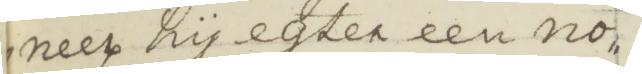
neer hij egter een no„
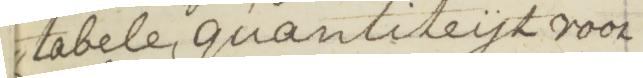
„tabele quantiteijt voor
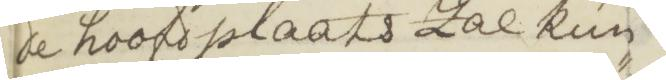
de hoofdplaats zal kun„
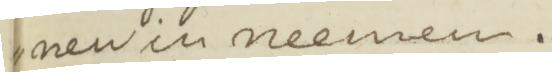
„nen in neemen.
